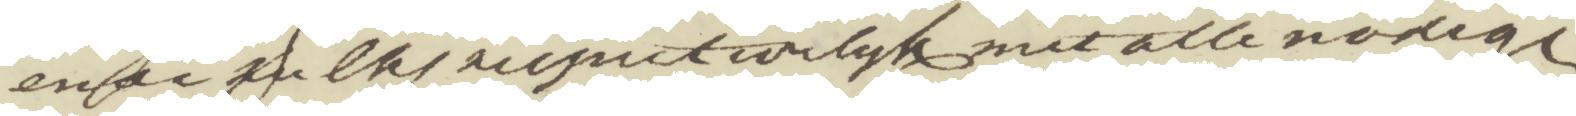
en de zulks respectivelyk met alle nodige
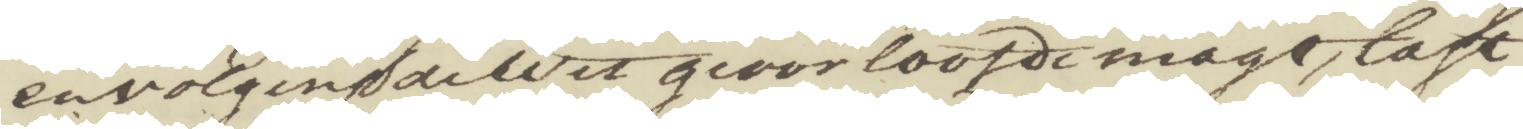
en volgens de wet geoorloofde magt, last
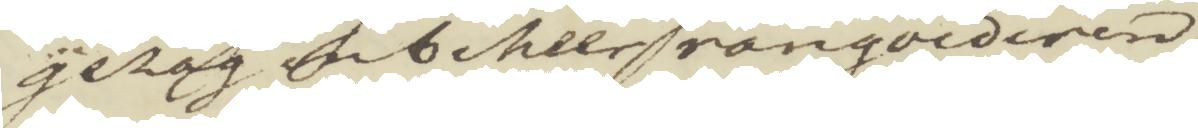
gezag en beheer van goederen
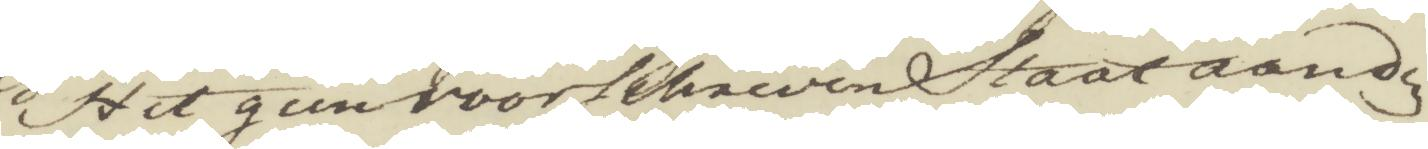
Het geen voorschreven staat aanden
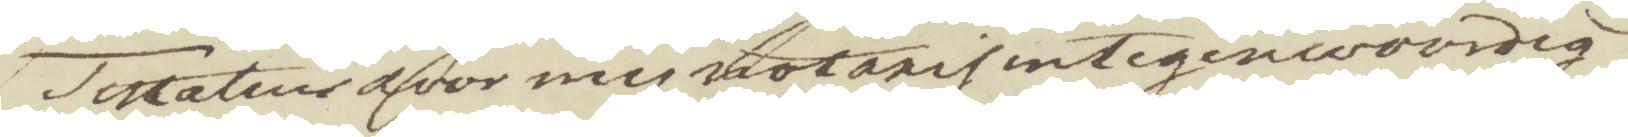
Testateur door my notaris in tegenwoordig:
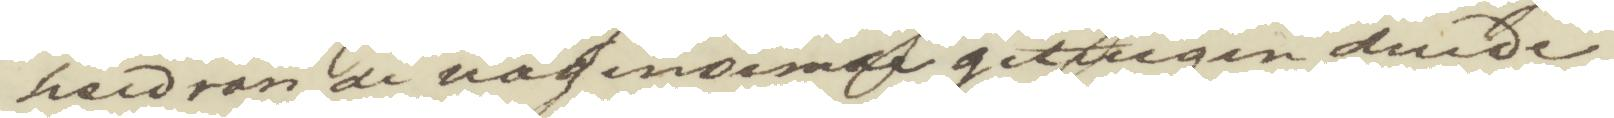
heid van de nagenoemde getuigen duide,
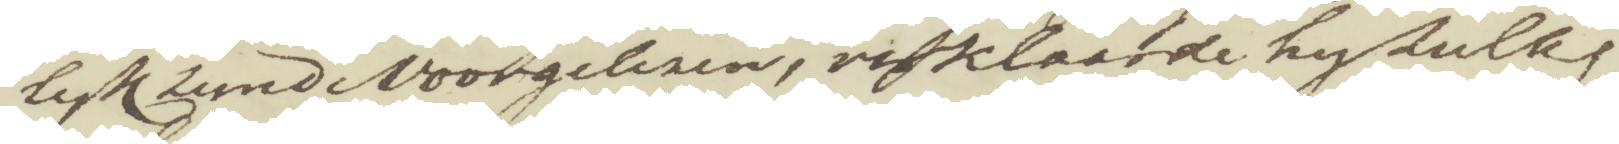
lyk zynde voorgelezen, verklaarde hy zulks
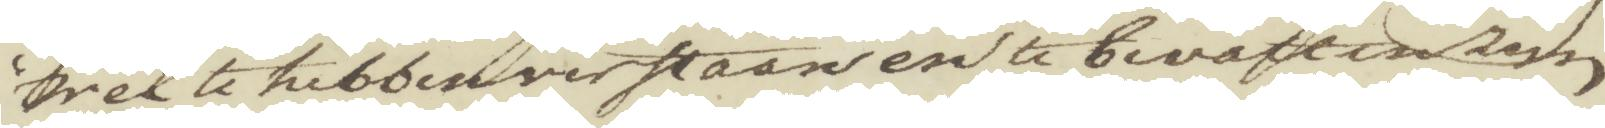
wel te hebben verstaan en te bevatten zyn
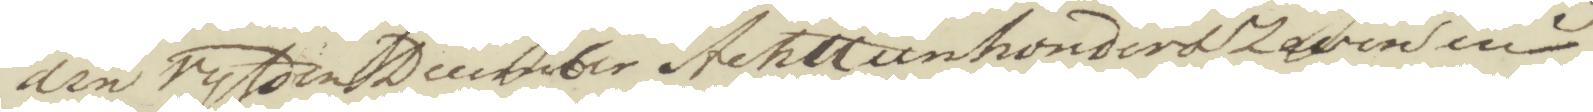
den vyfden December Achttienhonderdzeven en
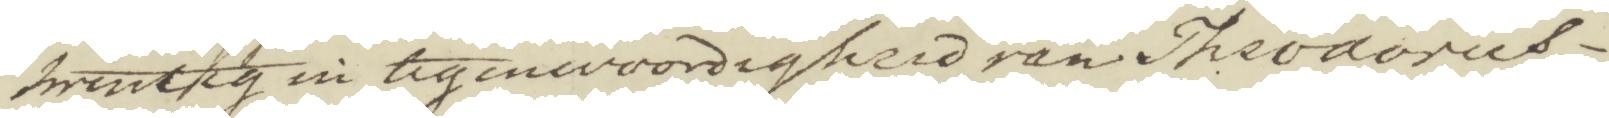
twintig in tegenwoordigheid van Theodorus-
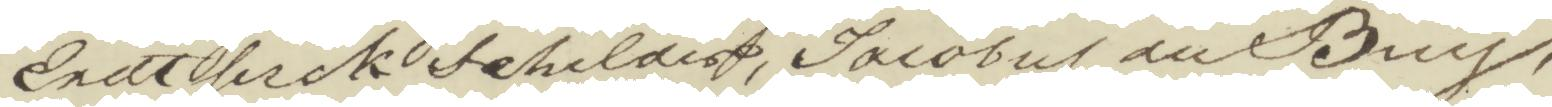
Erdtsieck Schilder, Jacobus du Buy,
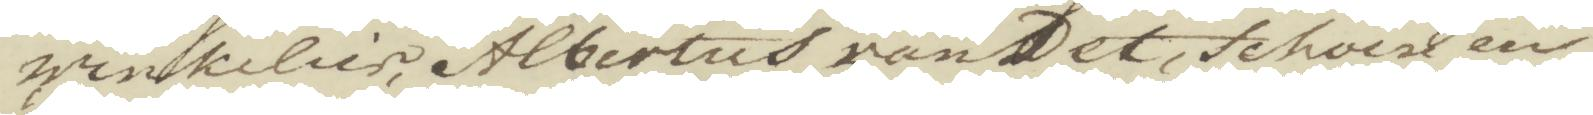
winkelier, Albertus van Det, schoen en
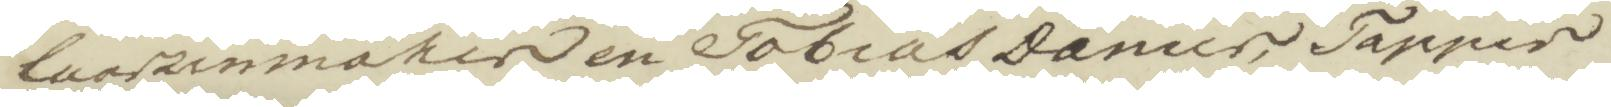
laarzenmaker en Tobias Damer, Tapper
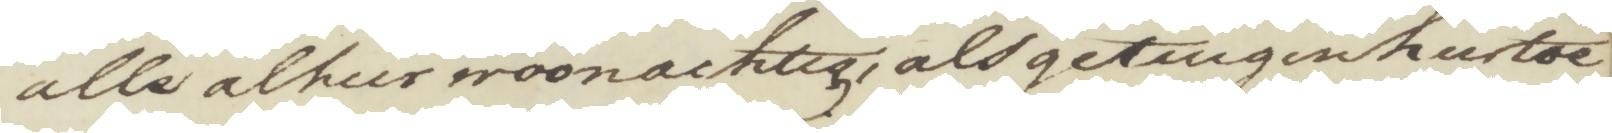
alle alhier woonachtig, als getuigen hiertoe
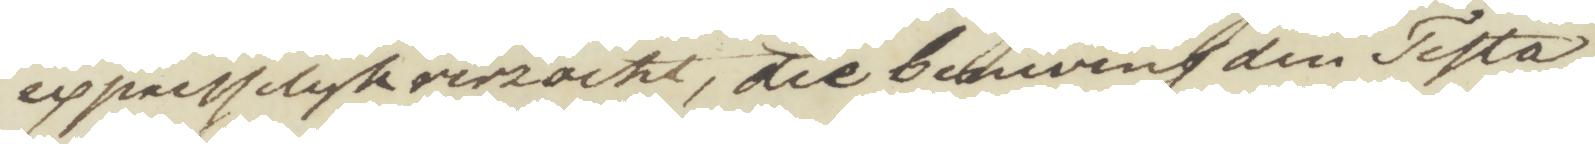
expresselyk verzocht, die benevens den Testa:
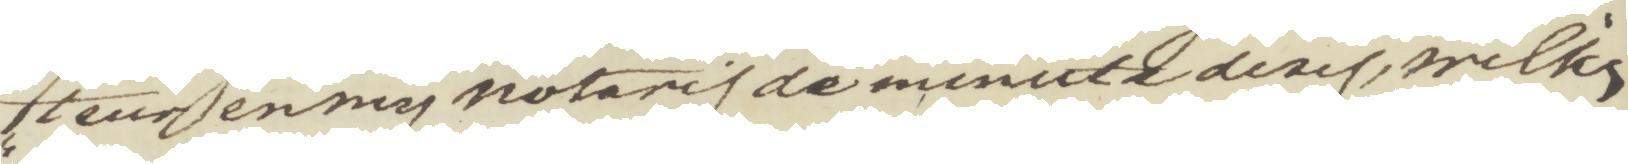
:teur en my notaris de minute dezes, welke
